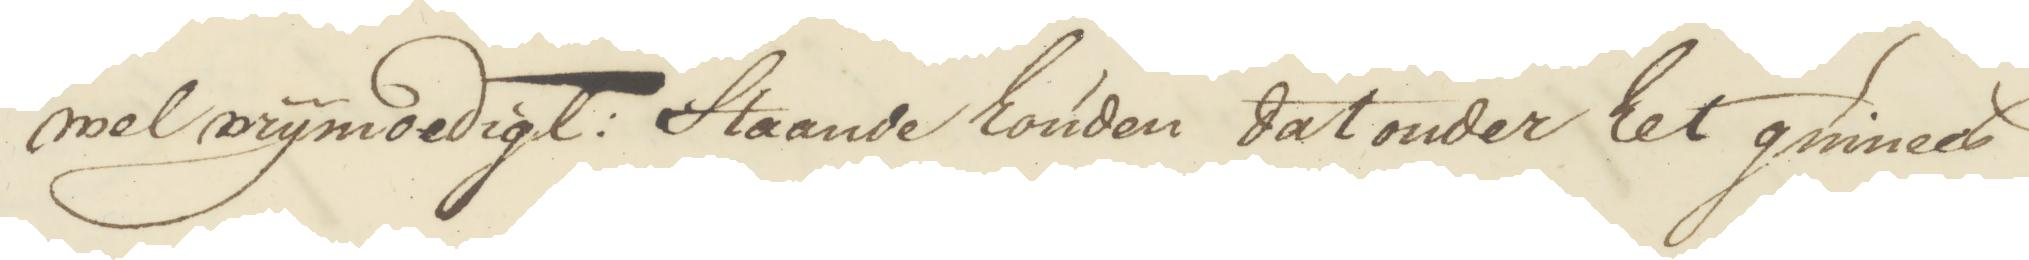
wel vrijmoedigl: staande houden dat onder het guinees
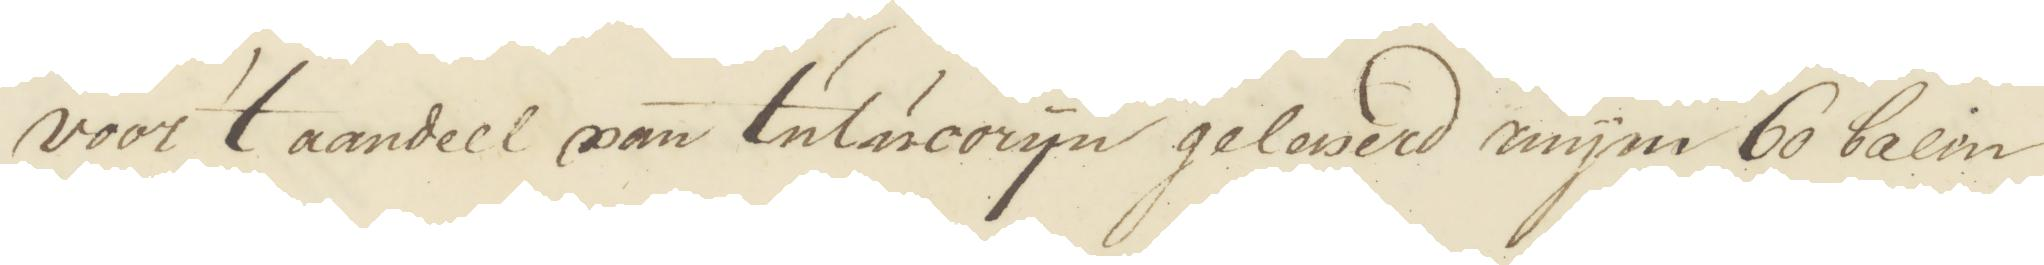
voor ’t aandeel van tutucorijn geleverd ruijm 60 balen
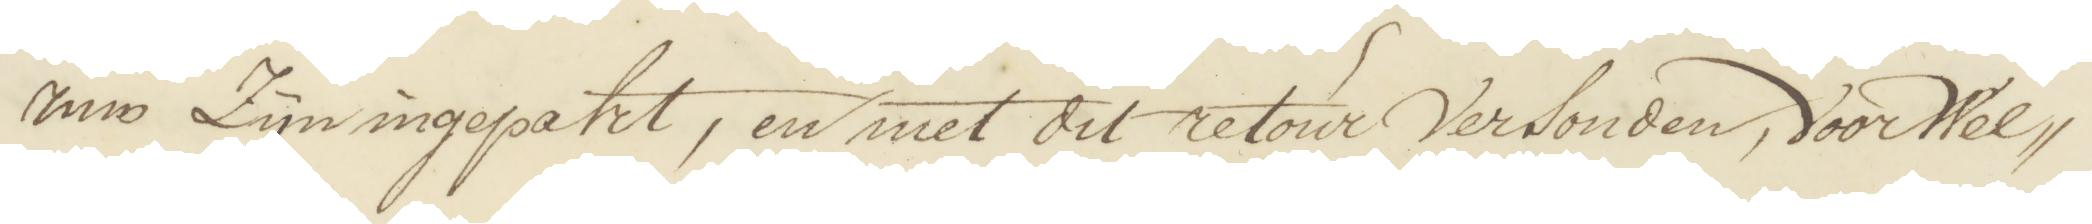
ruw zijn ingepakt, en met dit retour Versonden, Voor Wel„
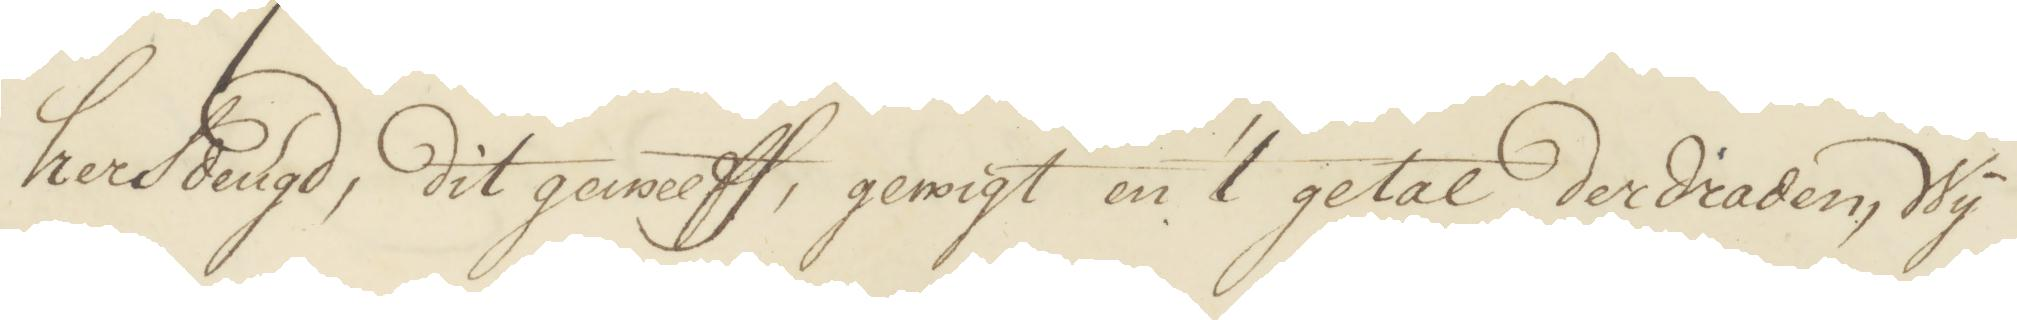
kers deugd, dit geweeff, gewigt en ’t getal der draden, Wij
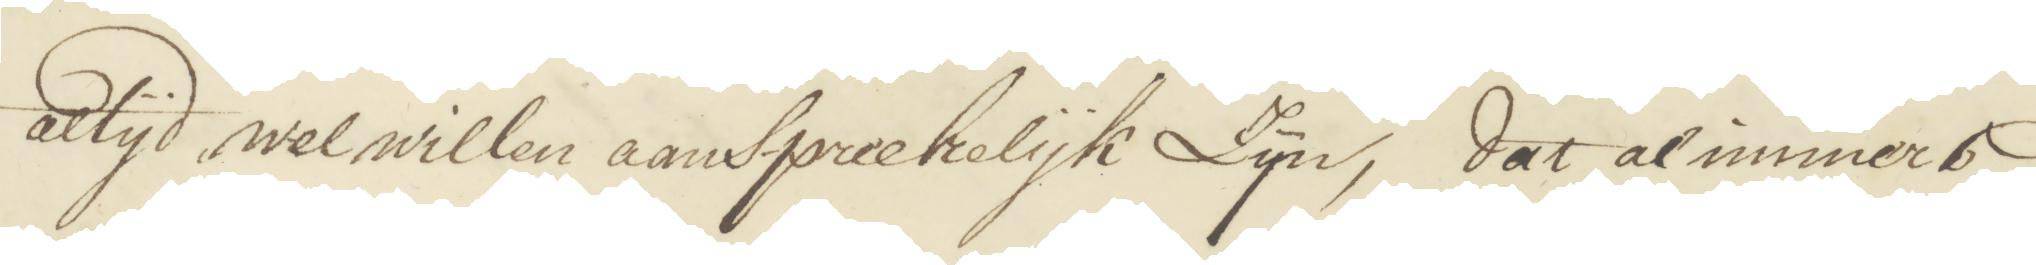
altijd, wel willen aanspreekelijk zijn, dat al immers
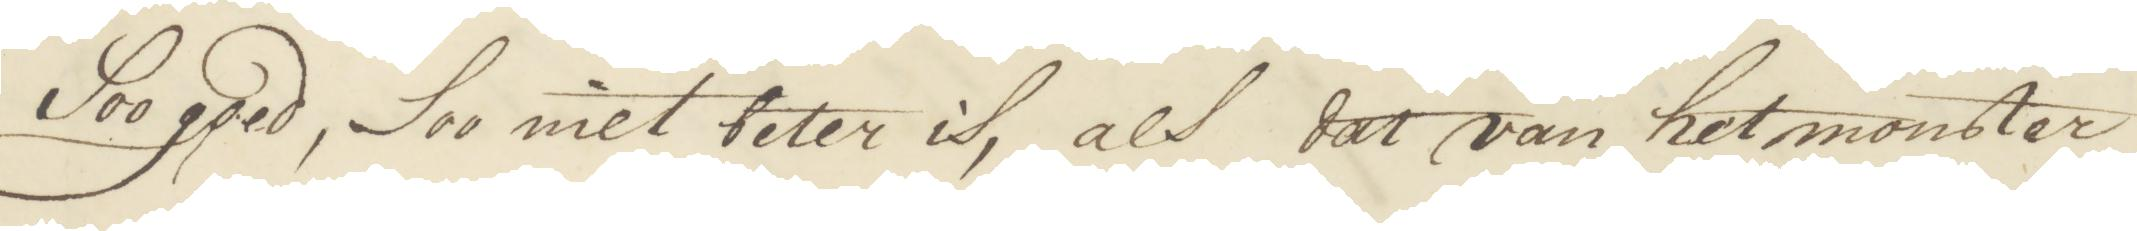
soo goed, soo niet beter is, als dat van het monster
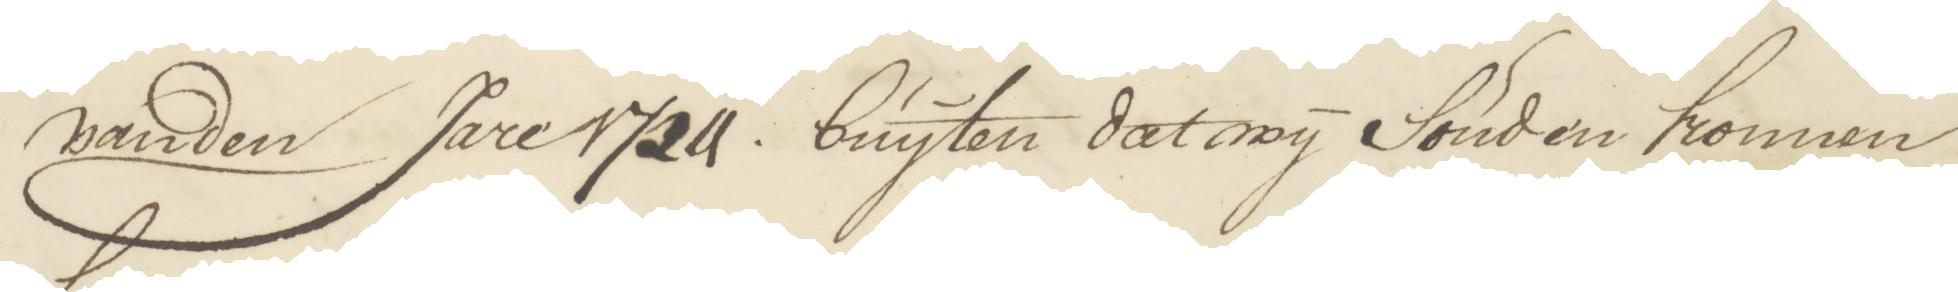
vanden Jare 1724. buijten dat wij souden konnen
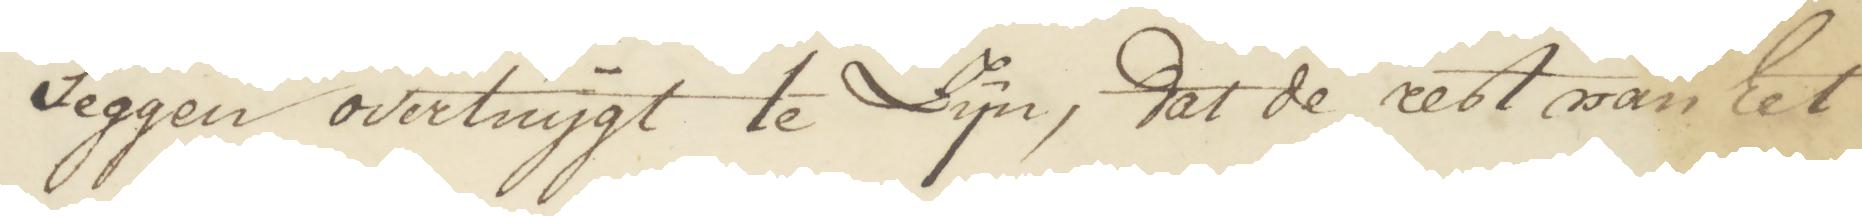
seggen overtuijgt te zijn, dat de rest van het
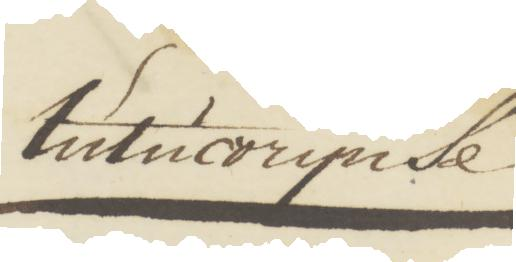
tutucorijnse
